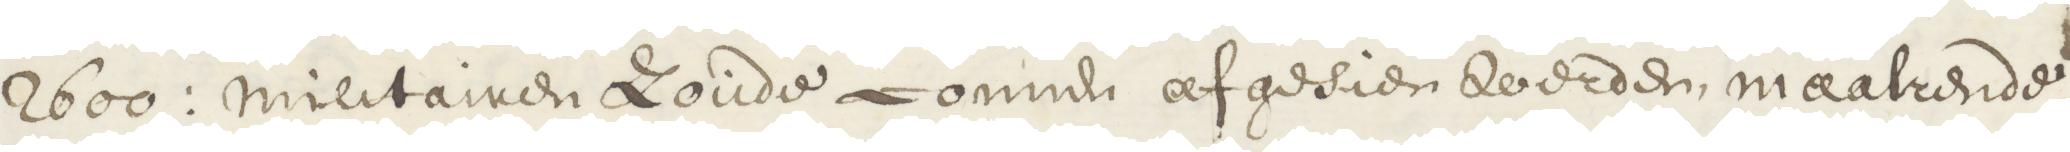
2600: militairen Zoude connen afgesien werden, maakende
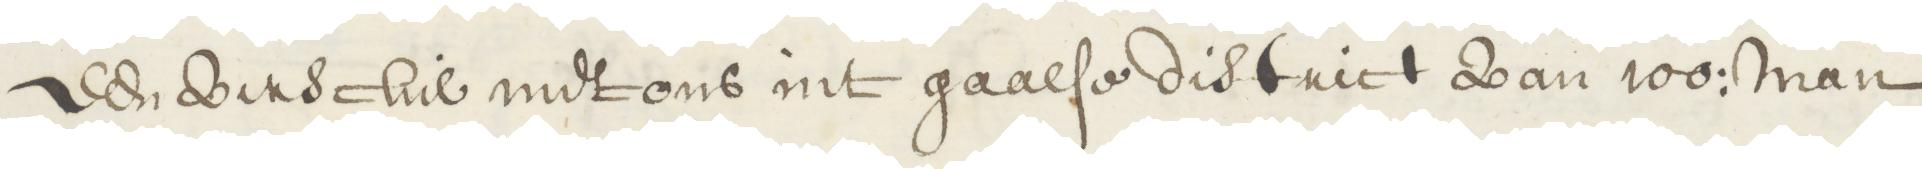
een verschil met ons int gaalse district van 100: man
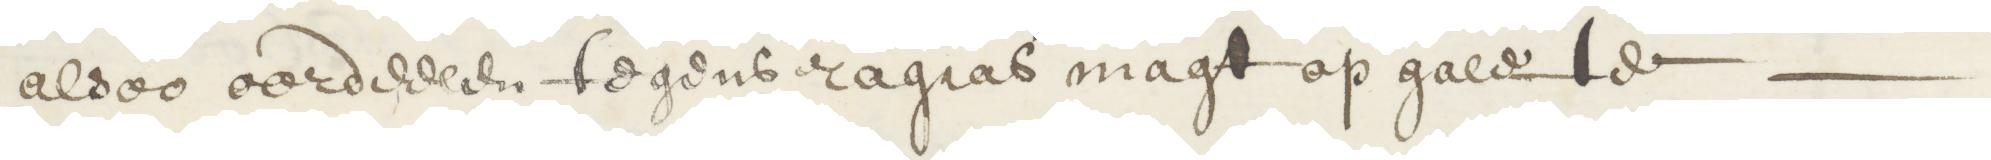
alsoo oordeelen tegens ragias magt op gale te —
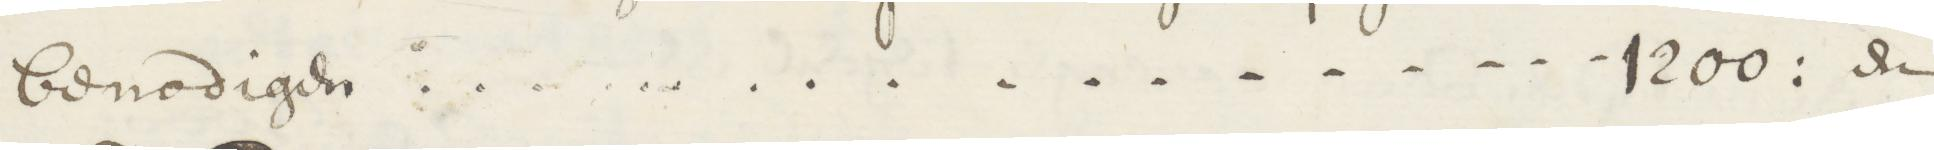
benodigen. . . . . . . . . . . . . . . . . . 1200: en
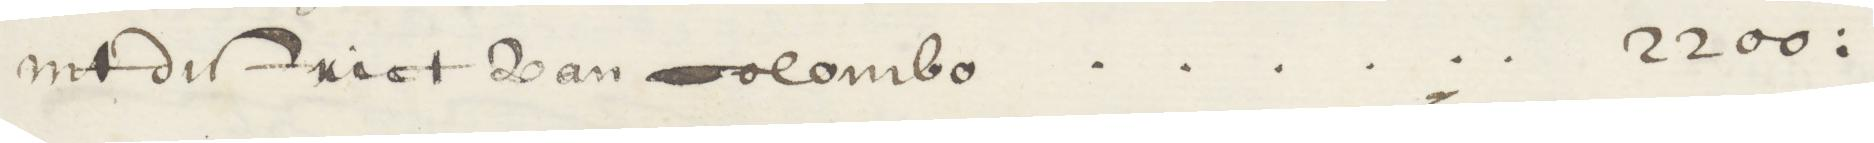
int district van colombo . . . . . . 2200:
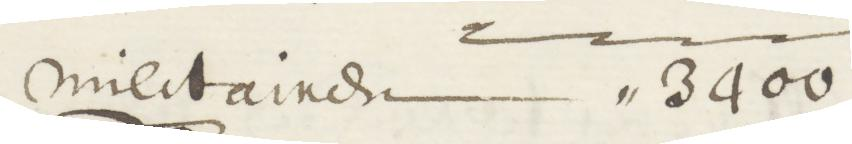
militairen— „ 3400
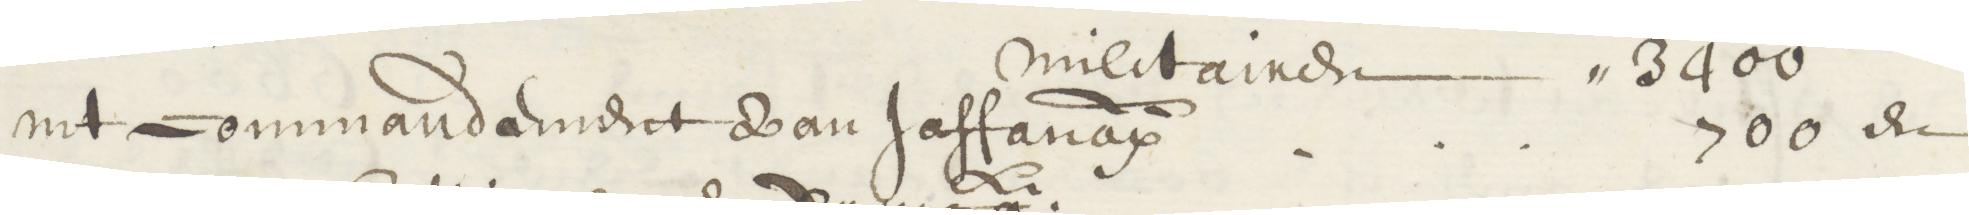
int commandement van Jaffanap . . .700 en
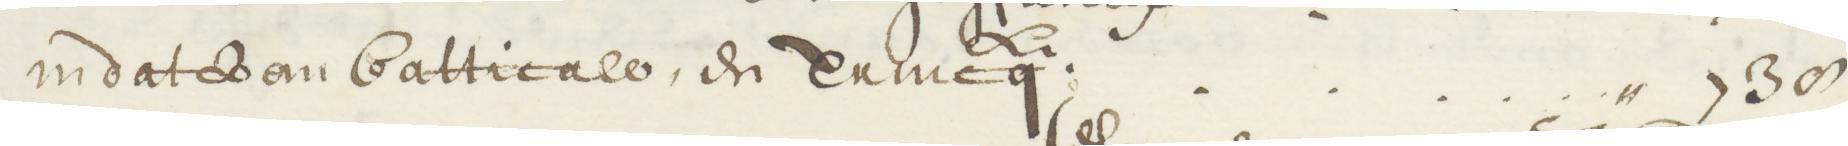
in dat van batticalo, en Trincq: . . . . . . „ 738
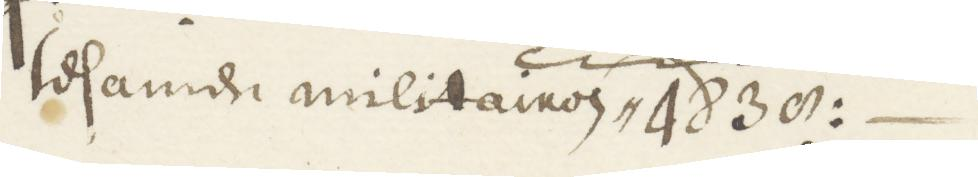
tesamen militairen „ 4838: —
